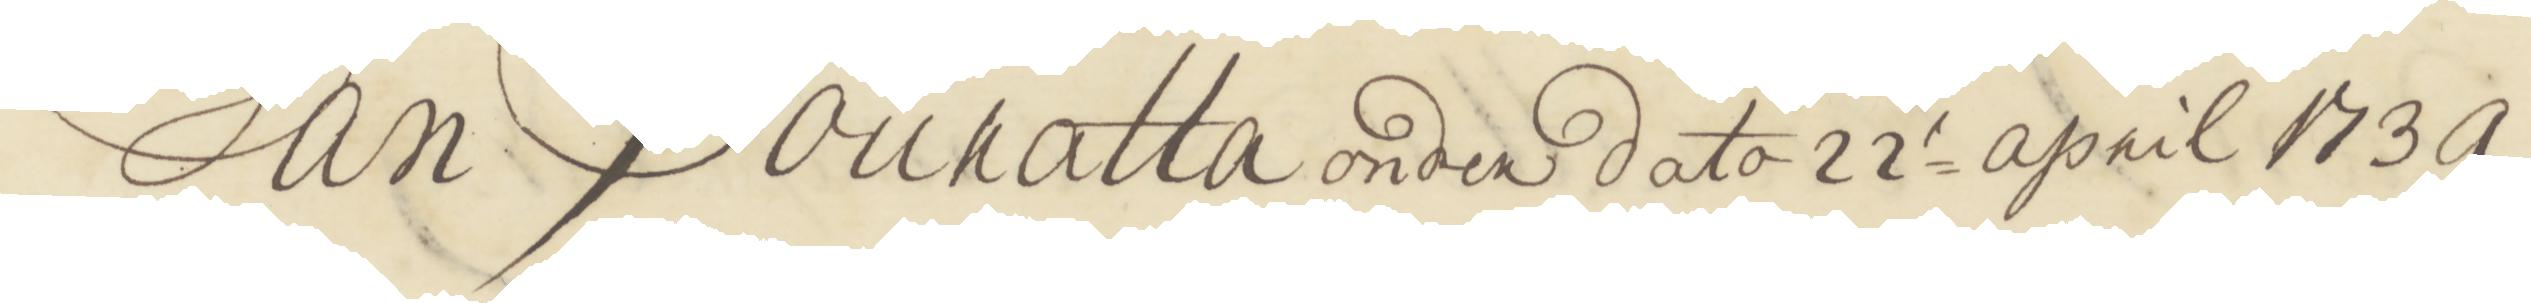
Van Souratta onder dato 22=' april 1739
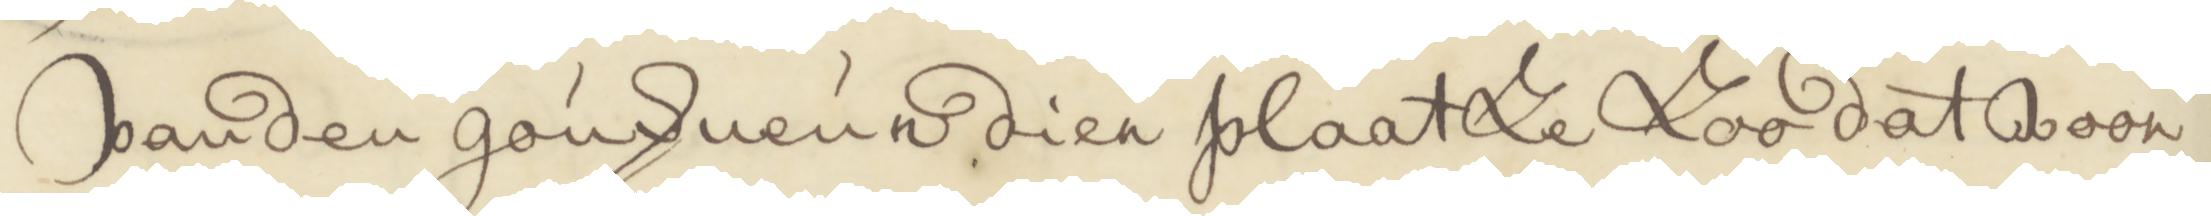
van den gouverneur dier plaatze zoo dat voor
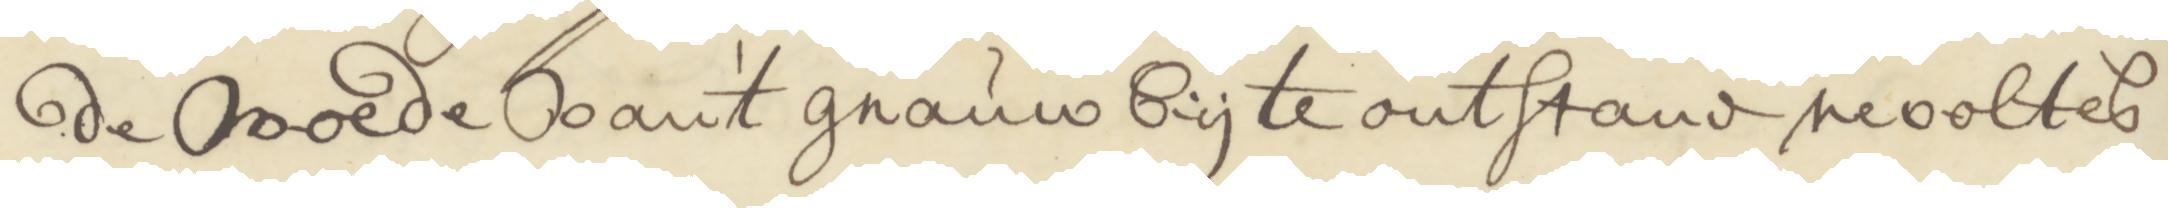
de woede van ’t grauw bij te ontstane revoltes
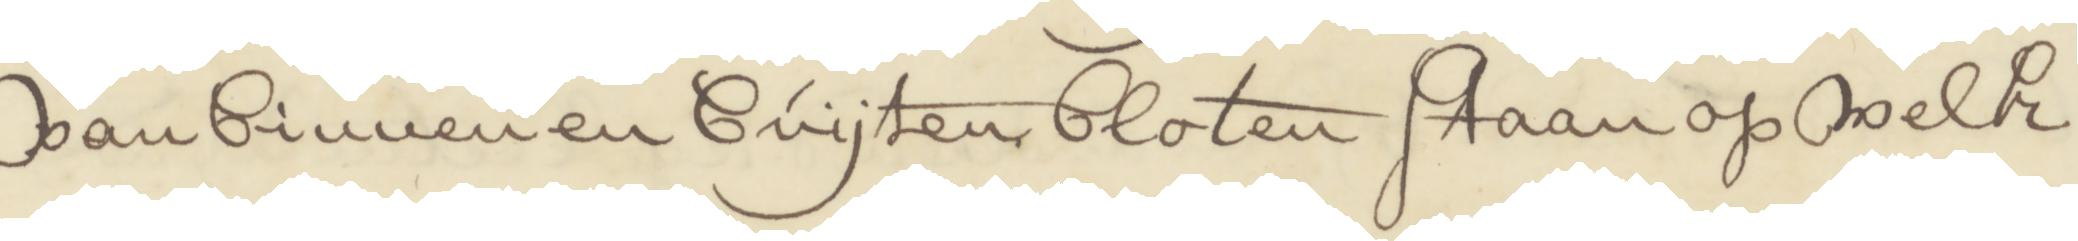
van binnen en buijten bloten staan op welk
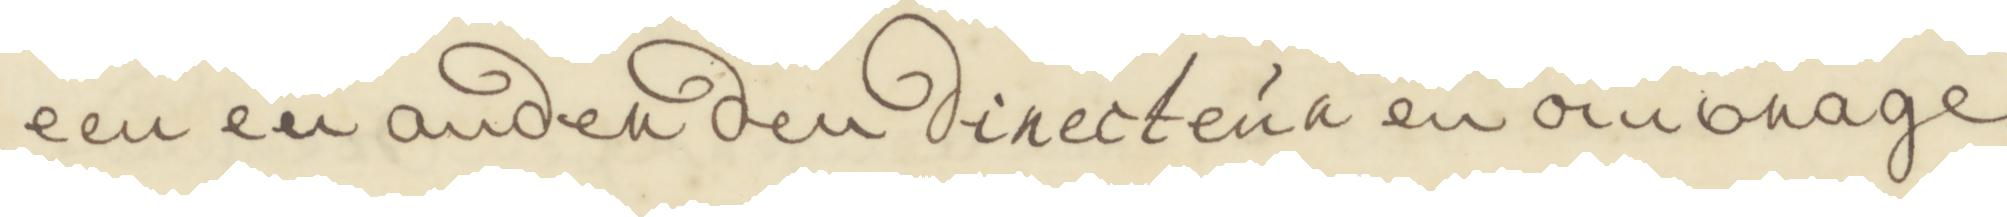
een en ander den directeur en om vrage
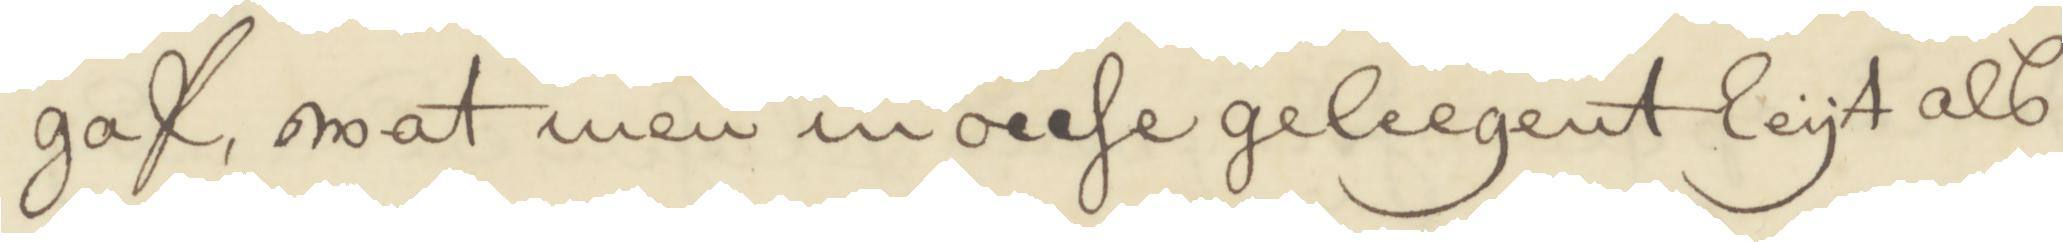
gaf, wat men in onse geleegentheijt als
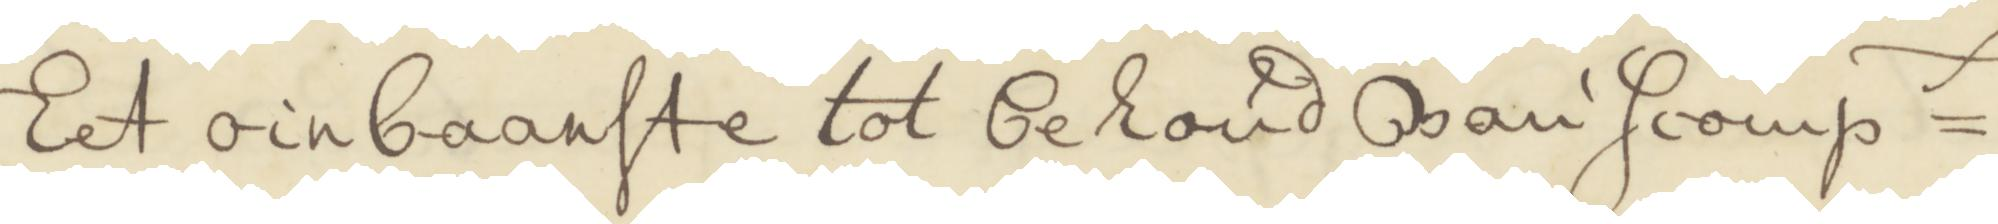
het oirbaarste tot behoud van 's comp=s
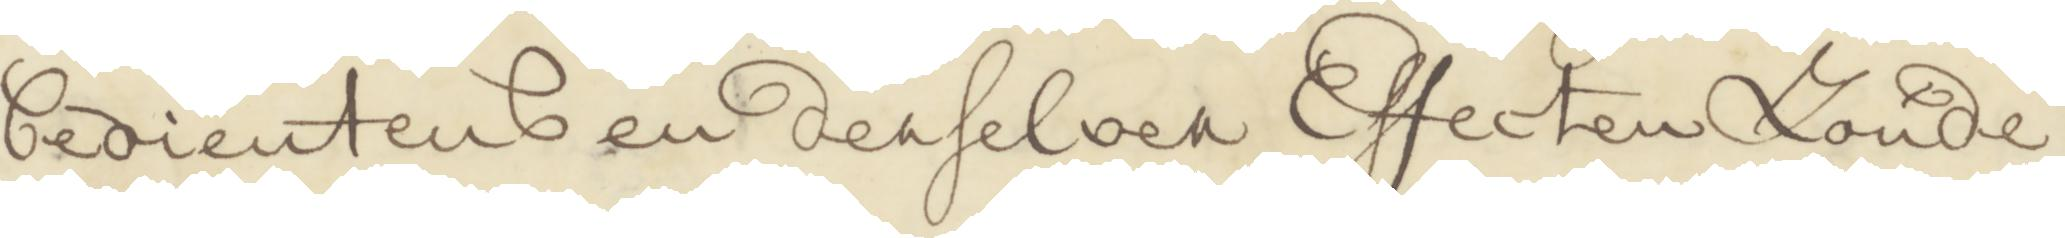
bedientens en derselver Effecten zoude
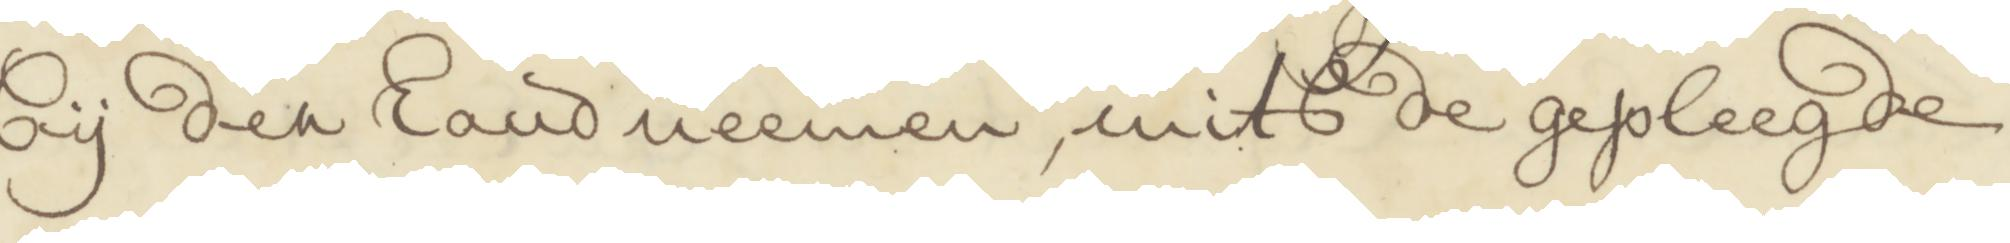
bij der hand neemen, mits de gepleegde
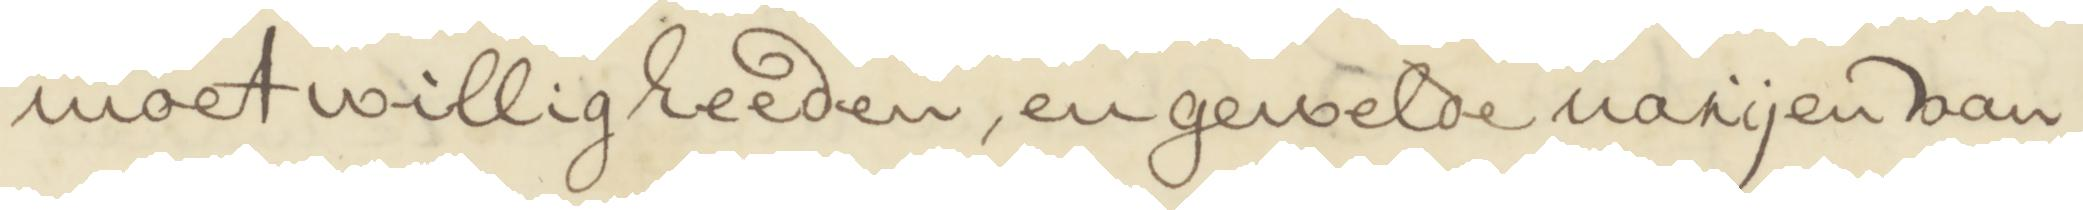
moet willig heeden, en gewelde narijen van
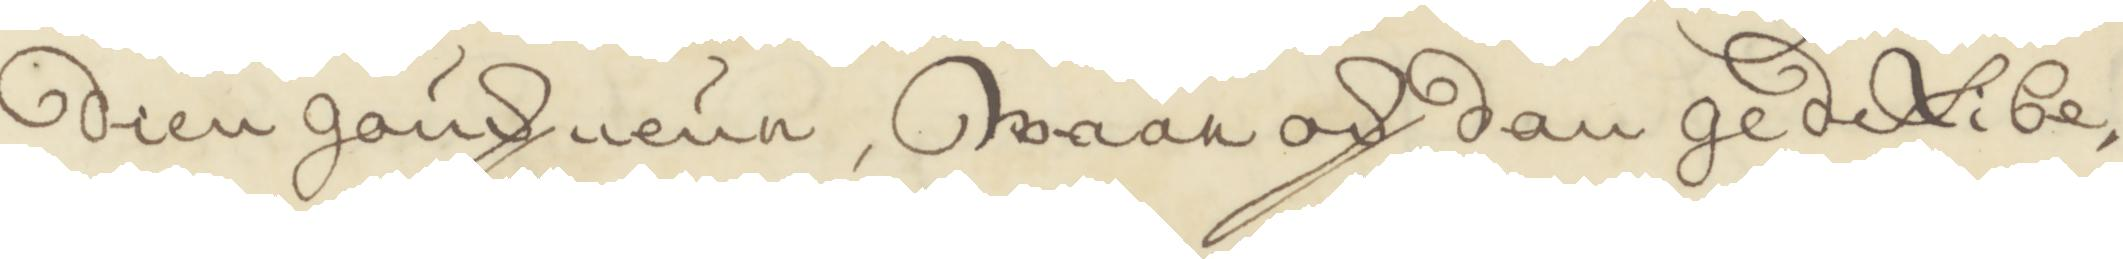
dien gouverneur, waar over dan gedelibe„
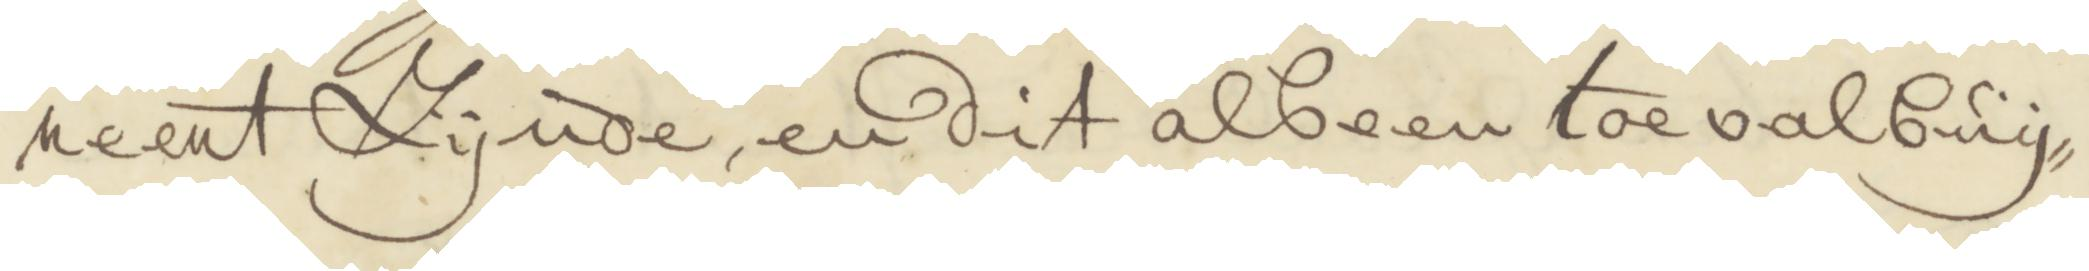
reert zijnde, en dit als een toe val buij„
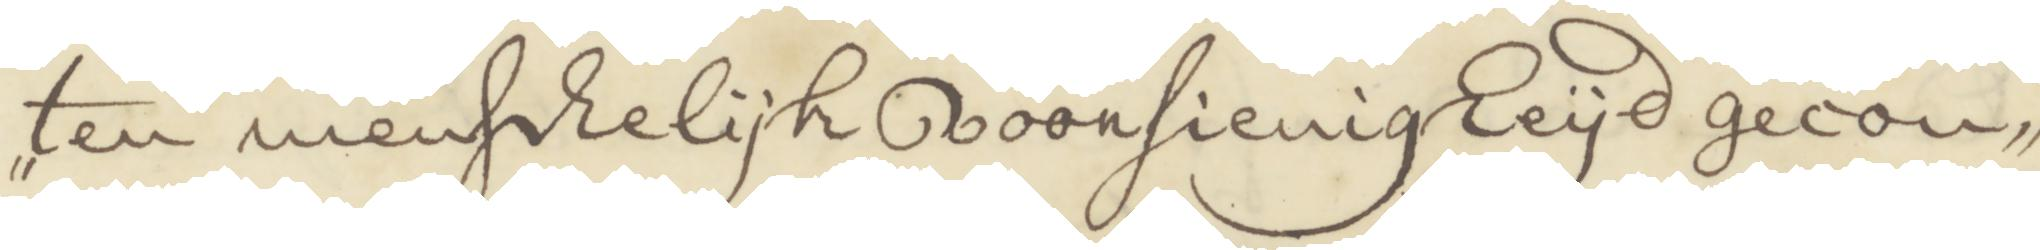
ten menschelijk voorsienigheijd gecon„
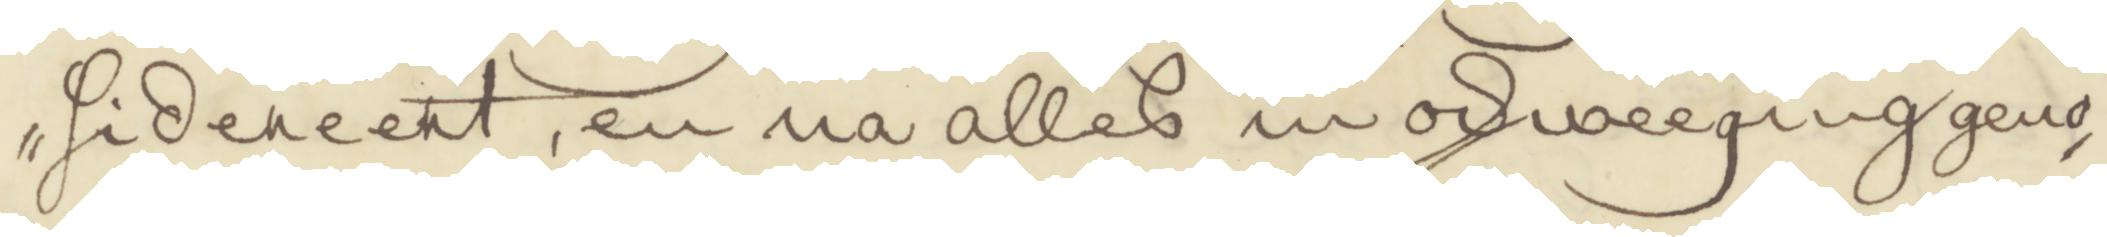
„sidereert, en na alles in overweeging geno„
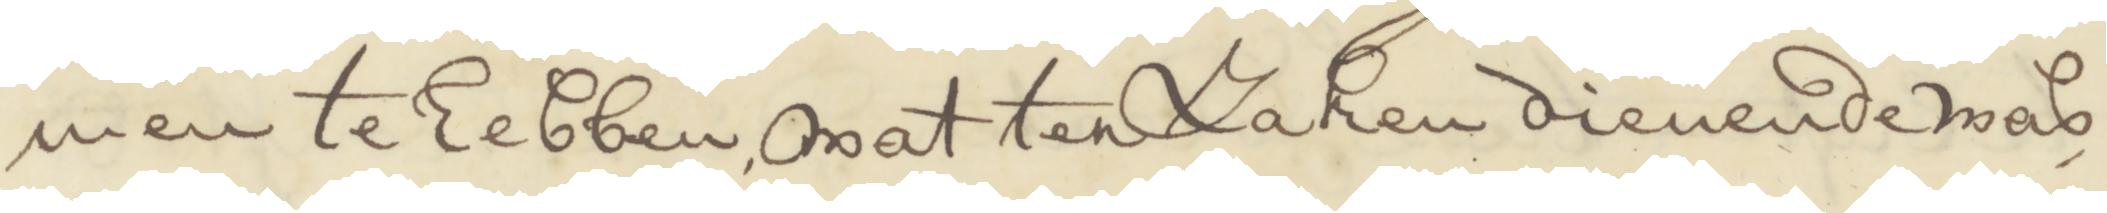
men te hebben, wat ter zaken dienende was,
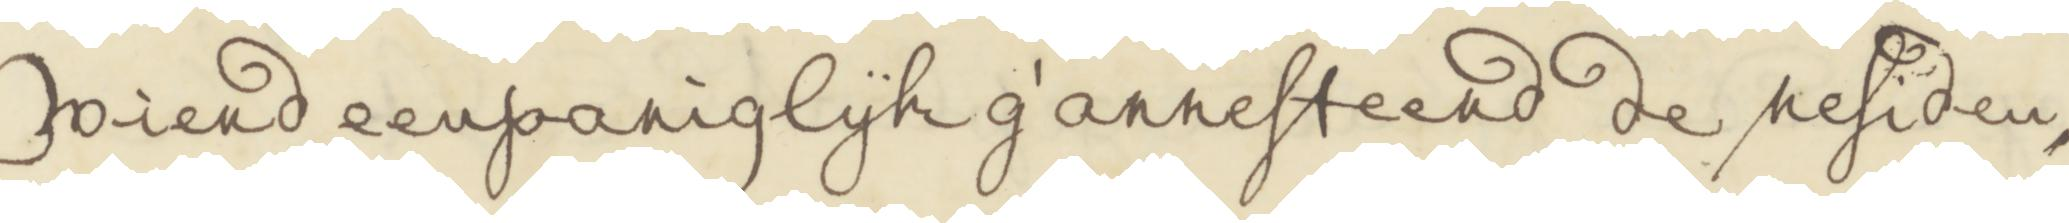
wierd eenpariglijk g’arresteerd de residen„
